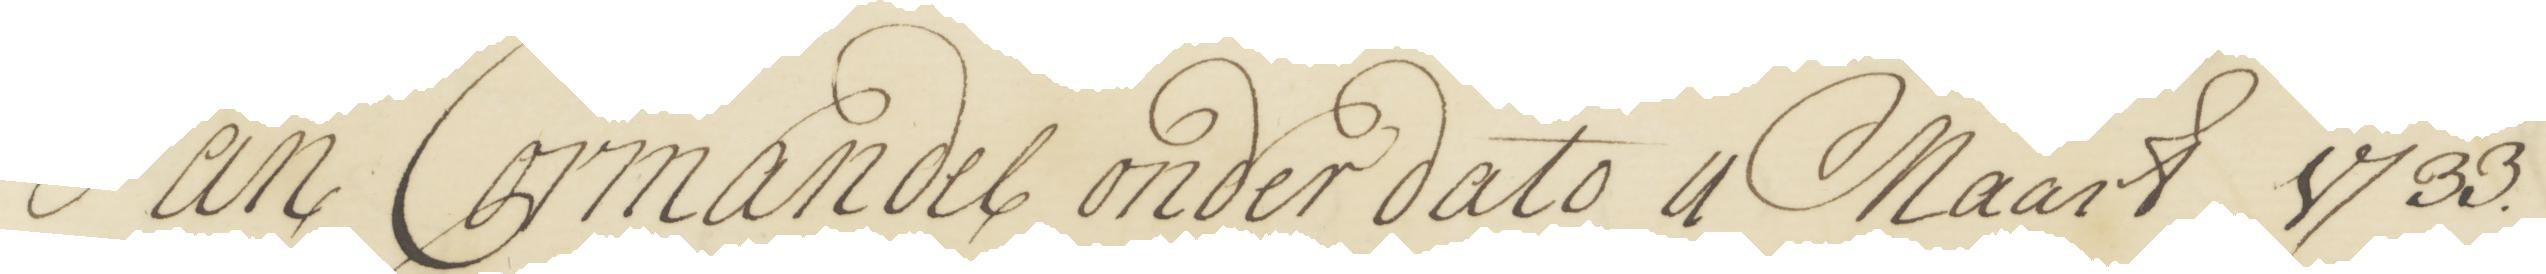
Van Cormandel onder dato 4 Maart 1733.
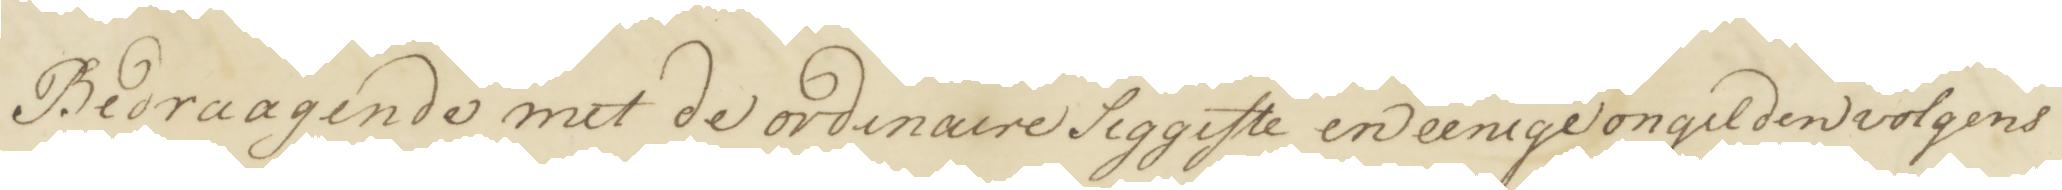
Bedraagende met de ordinaire siggifte en eenige ongelden volgens
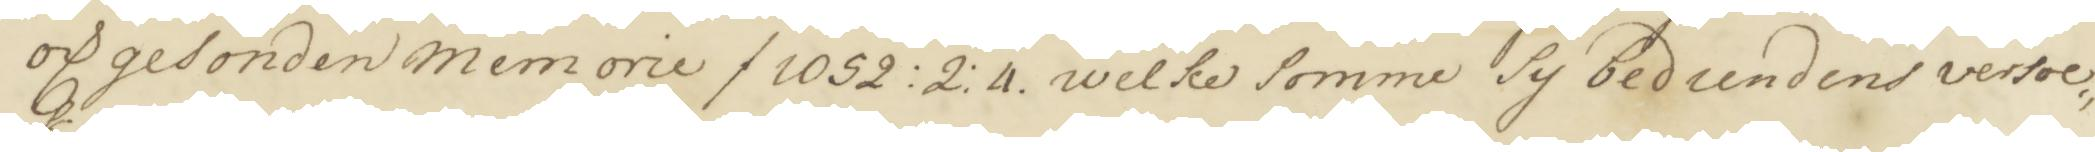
over gesonden memorie ƒ 1052:2:4. welke somme sy bediendens versoe
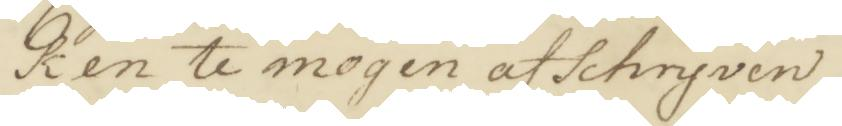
ken te mogen afschryven.
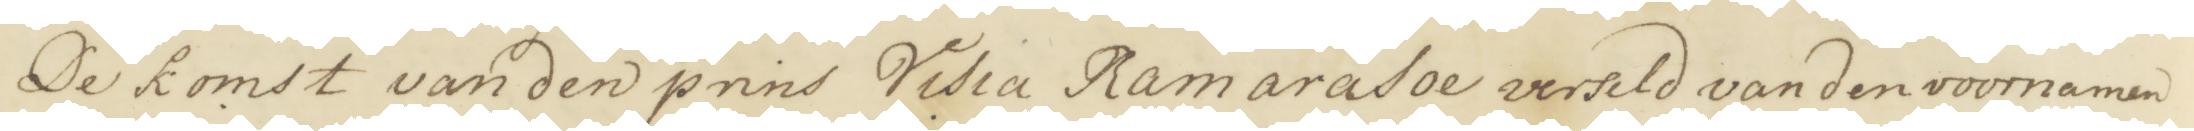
De komst van den prins Visia Ramarasoe verseld van den voornamen
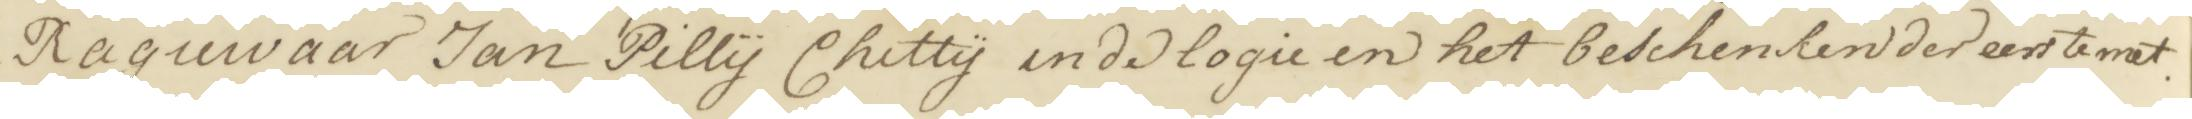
Ragiewaar Ian Pillij Chittij in de logie en het beschenken der eerste met.
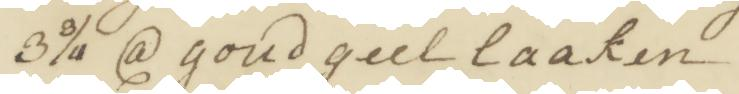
3¾ @ goud geel laaken
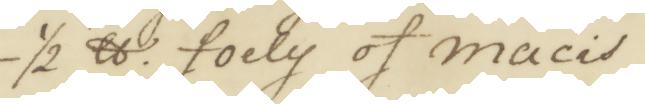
.½ lb. foely of macis
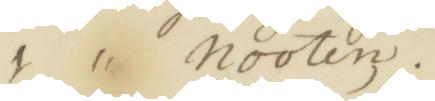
1 „ nooten.
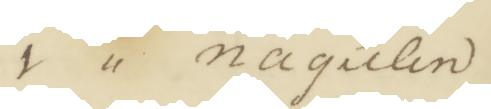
1 „ nagulen
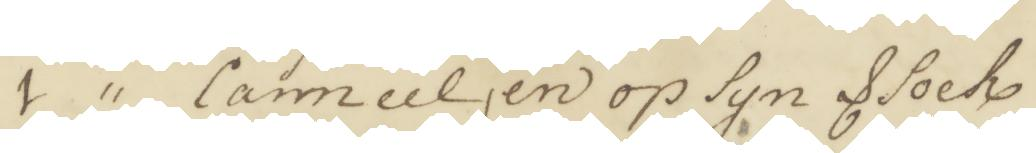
1 „ Canneel, en op syn versoek
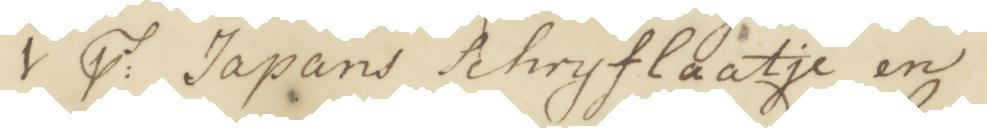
1 p:s Japans schryflaatje en
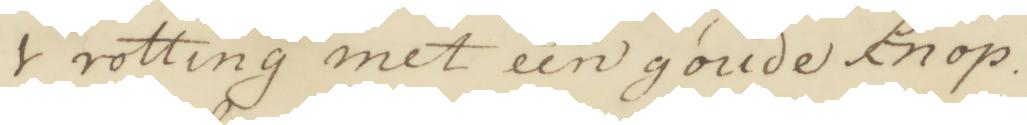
1 rotting met een goude knop
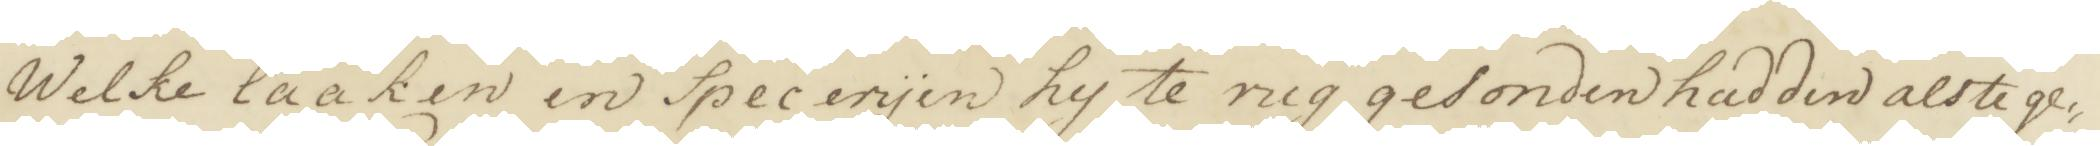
welke laaken en specerijen hy te rug gesonden hadden als te ge„
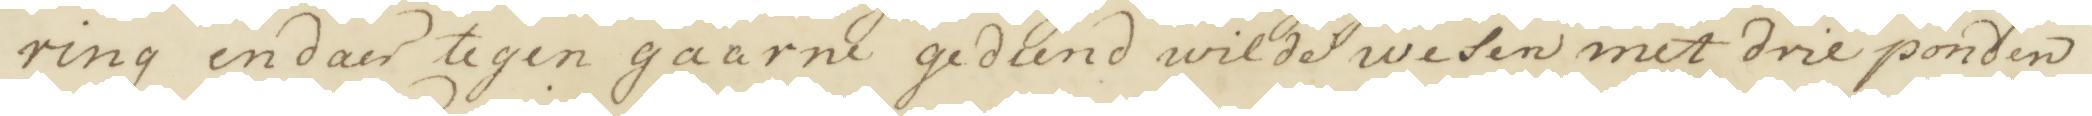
ring en daer tegen gaarne gediend wilde wesen met drie ponden
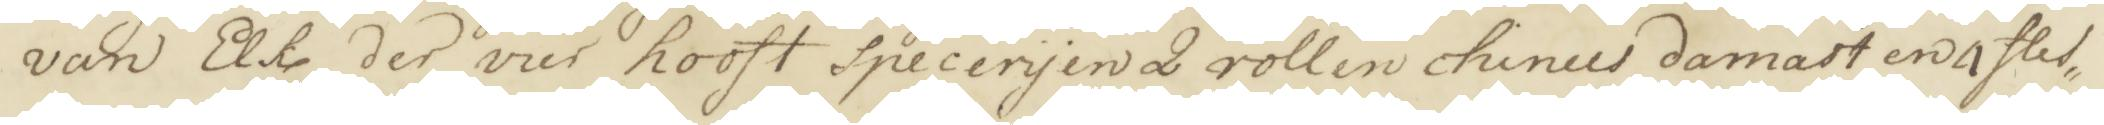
van Elk der vier hooft specerijen 2 rollen chinees damast en 4 fles„
